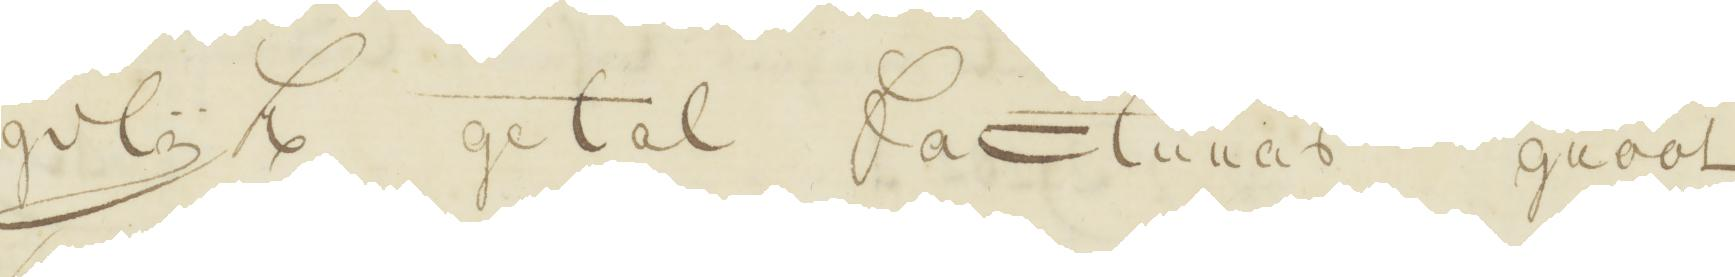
gelijk getal facturas groot
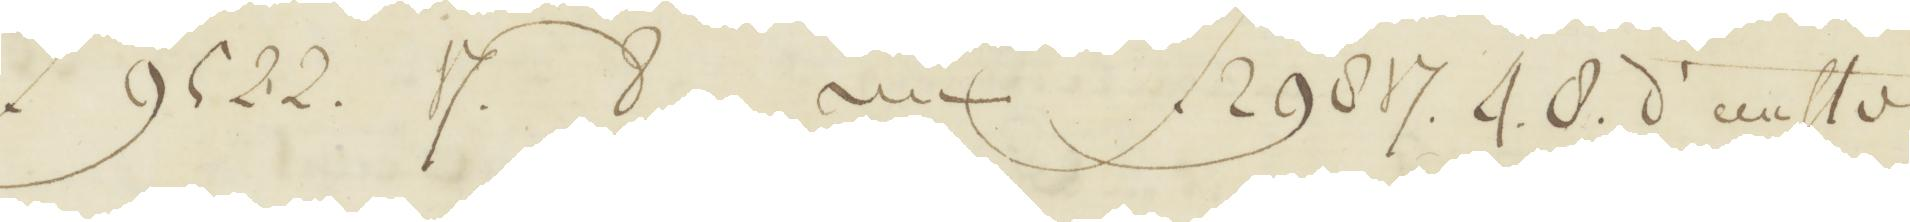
ƒ 9522. 17. 8 en ƒ29817. 4. 8. d’ eerste
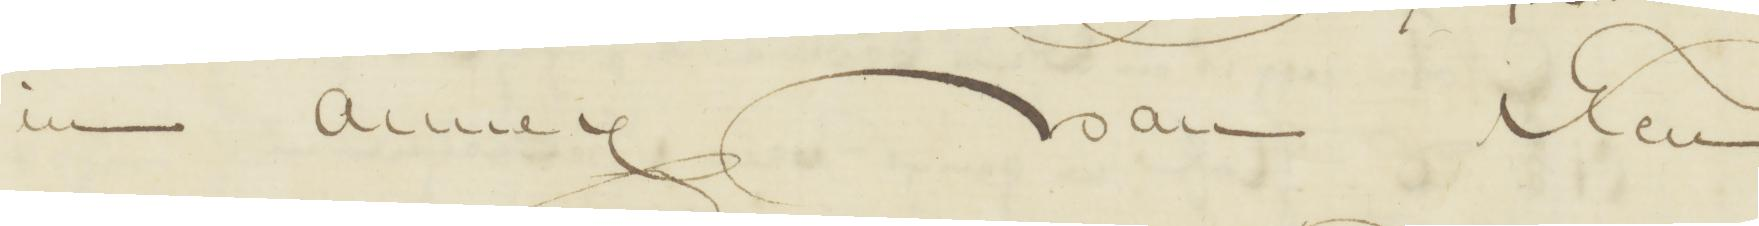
in annex van Een
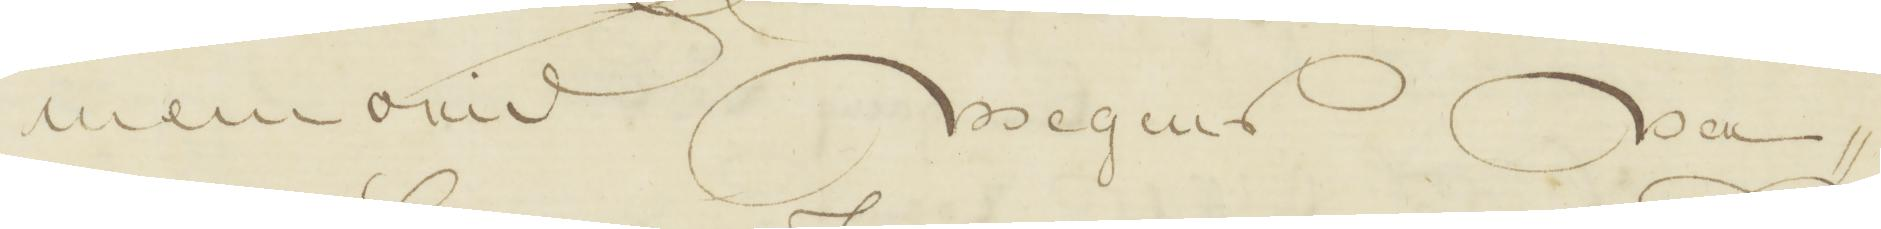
memorie wegens ver„
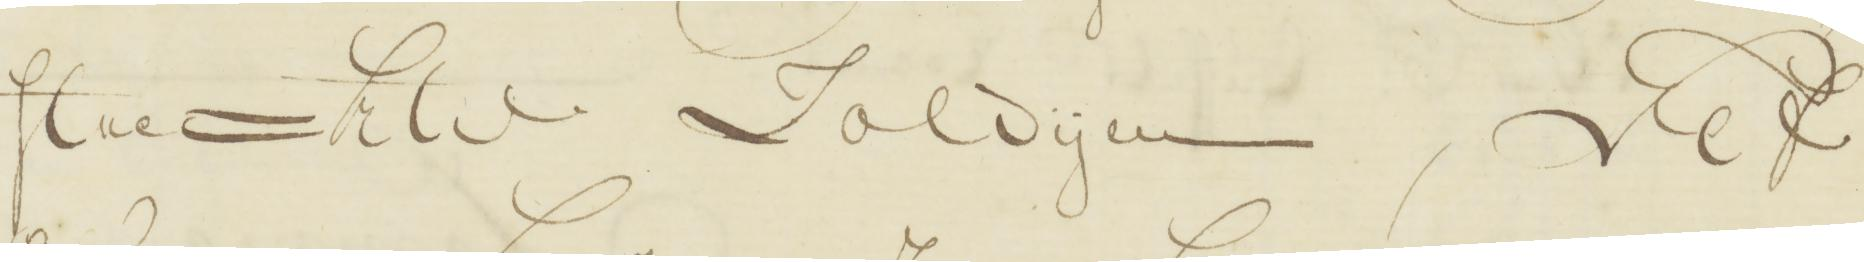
streckte zoldijen, Elf
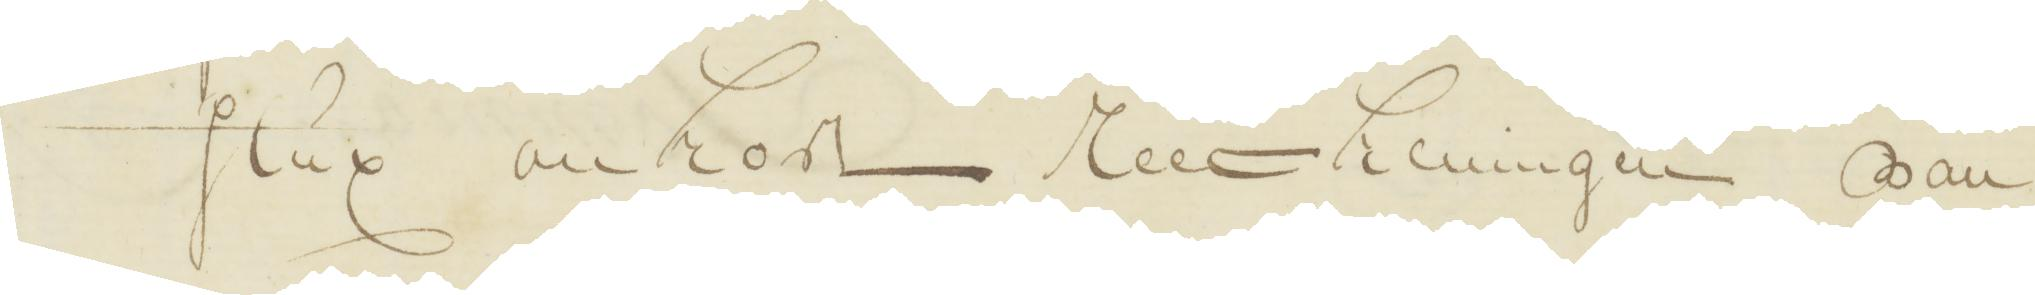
stux onkost reeckeningen van
